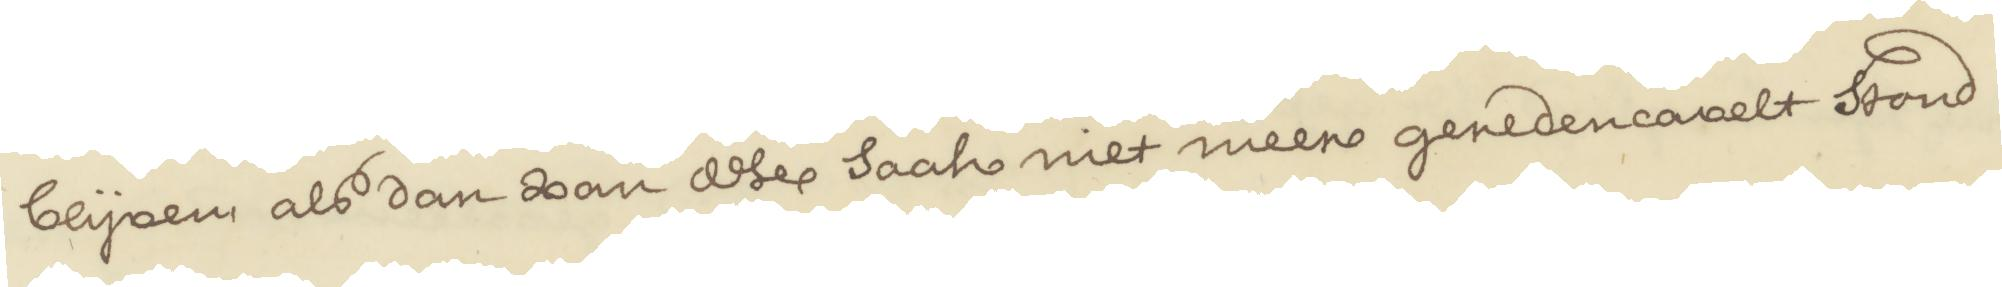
blijven, als dan van dese saak niet meer geredencavelt stond
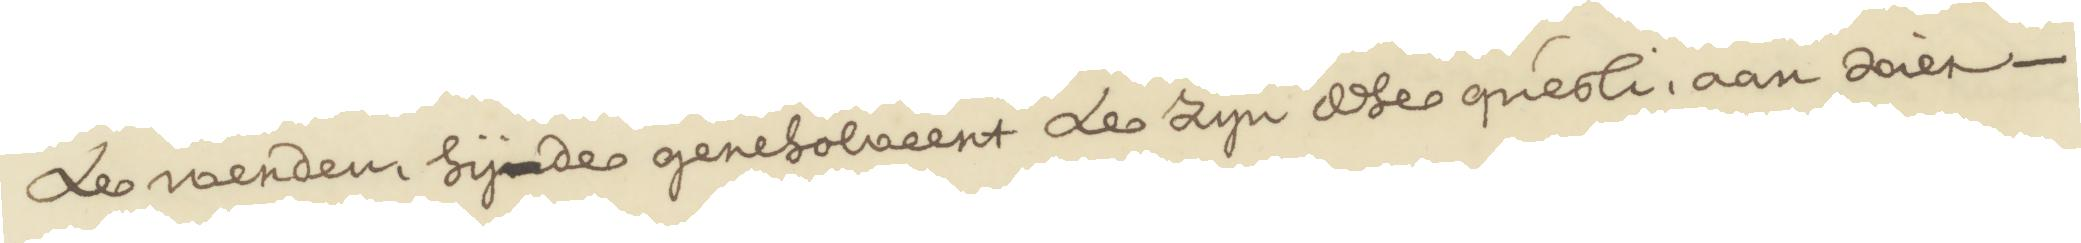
te werden, sijnde geresolveert te zijn dese questi, aan vier —
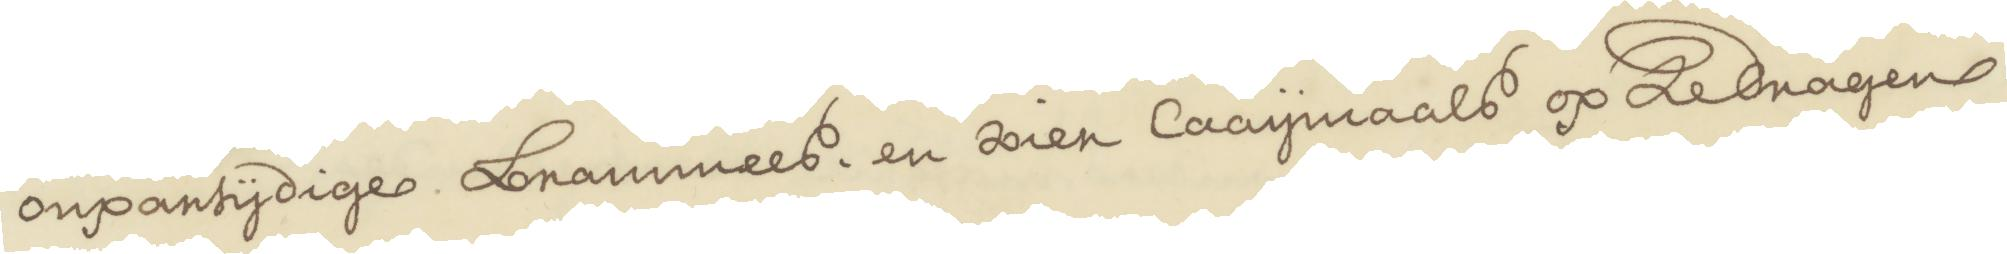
onpartijdige brammees, en vier Caaijmaals op te dragen
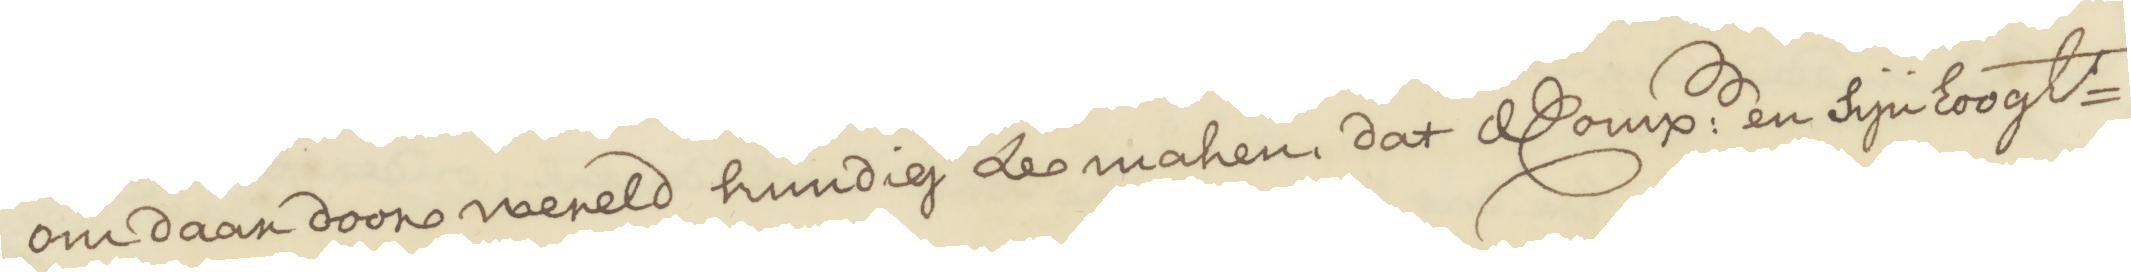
om daar door wereld kundig te maken, dat dComp: en sijn hoogh=t
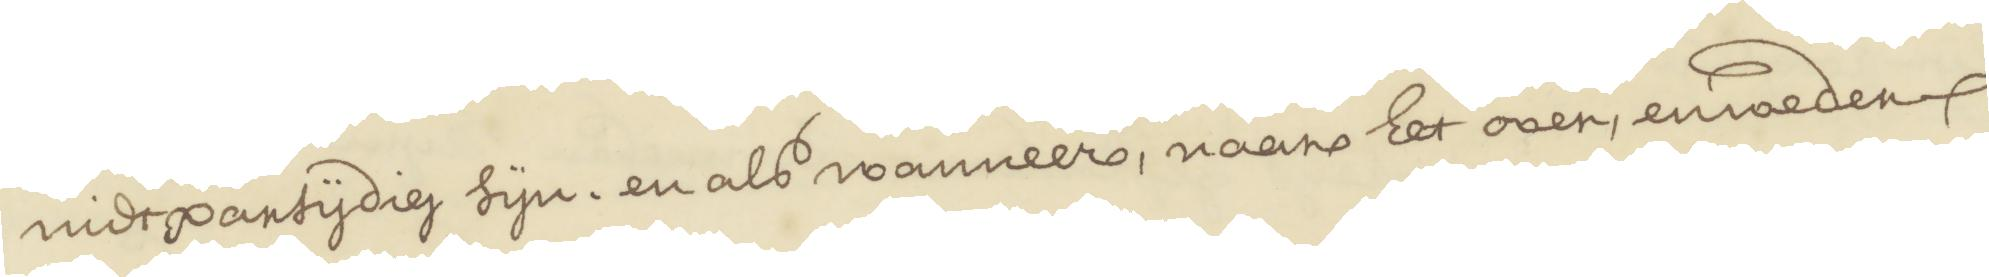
niet partijdig sijn, en als wanneer, naar het over, en weder
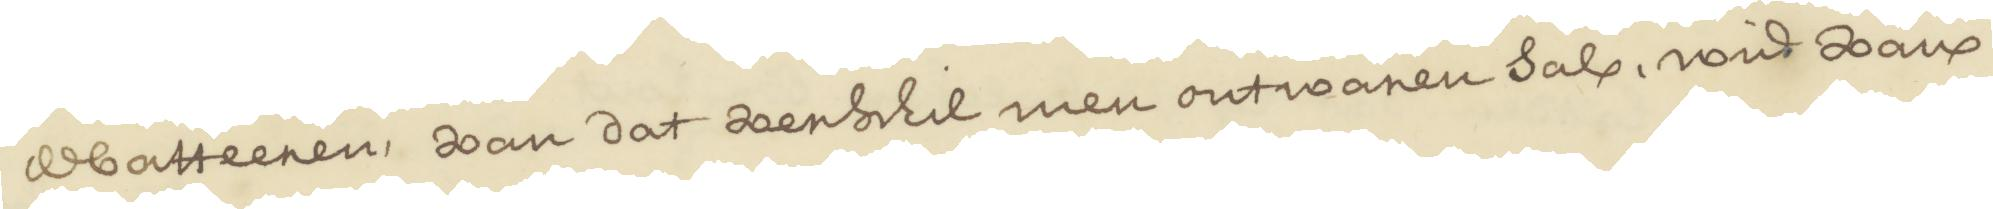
debatteeren, van dat verschil men ontwaren sal, wie van
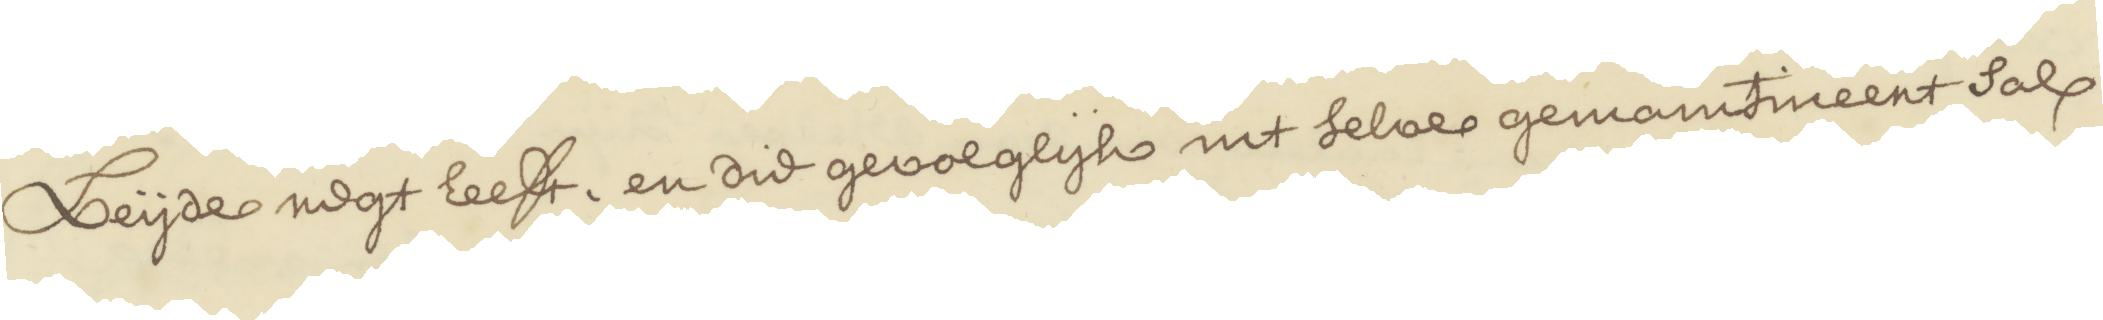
beijde regt heeft, en die gevolglijk int selve gemaintineert sal
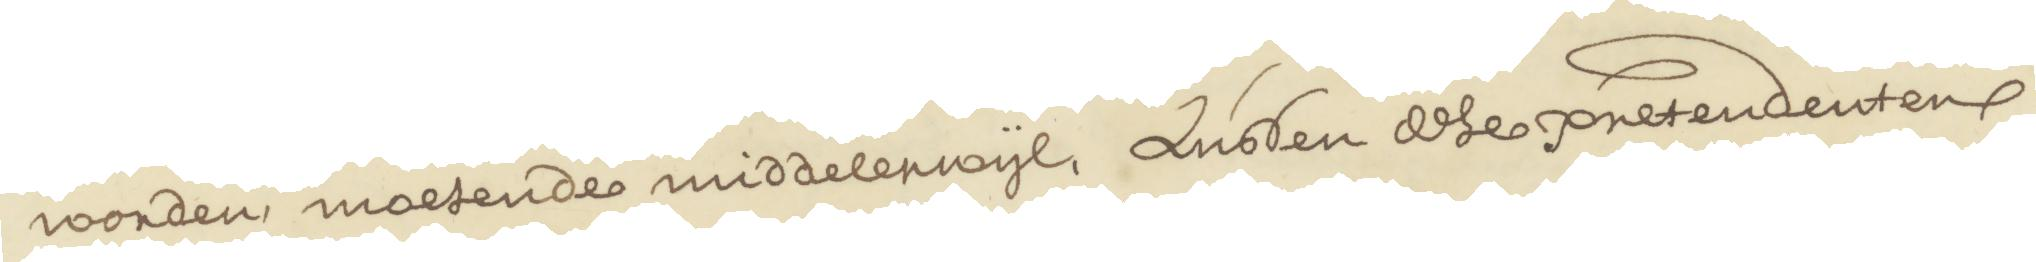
worden, moetende middelerwijl, tussen dese pretendenten
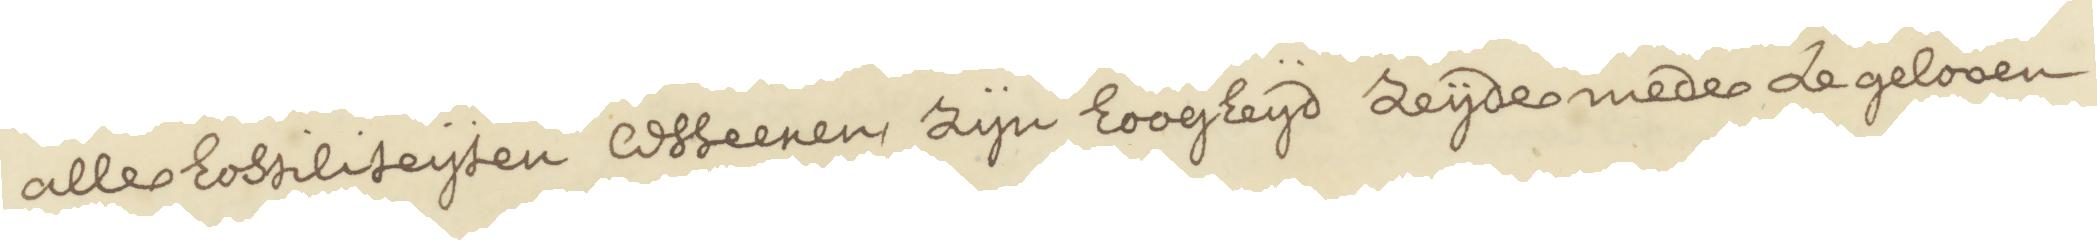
alle hostiliteijten cesseeren, zijn hoogheijd zeijde mede te geloven
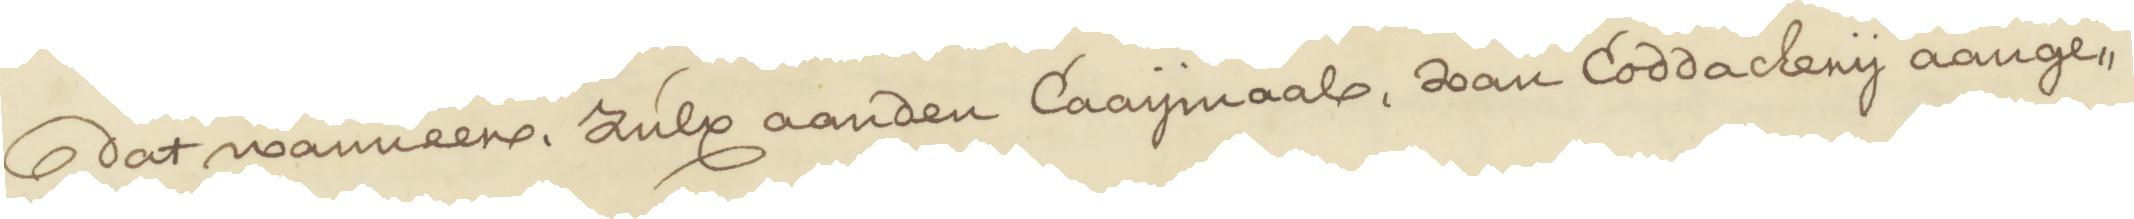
dat wanneer, zulx aanden Caaijmaal, van Coddacherij aange„
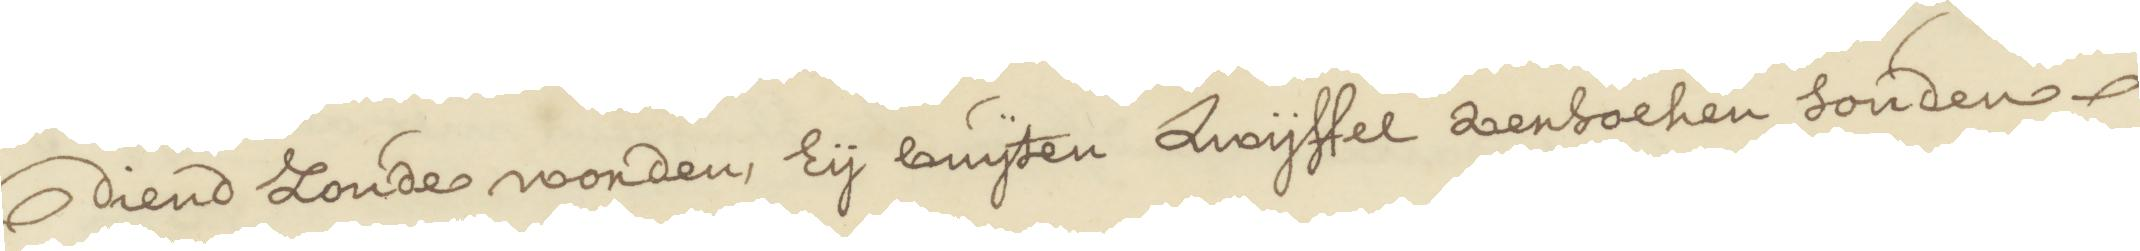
diend zoude worden, hij buijten twijffel versoeken souden —
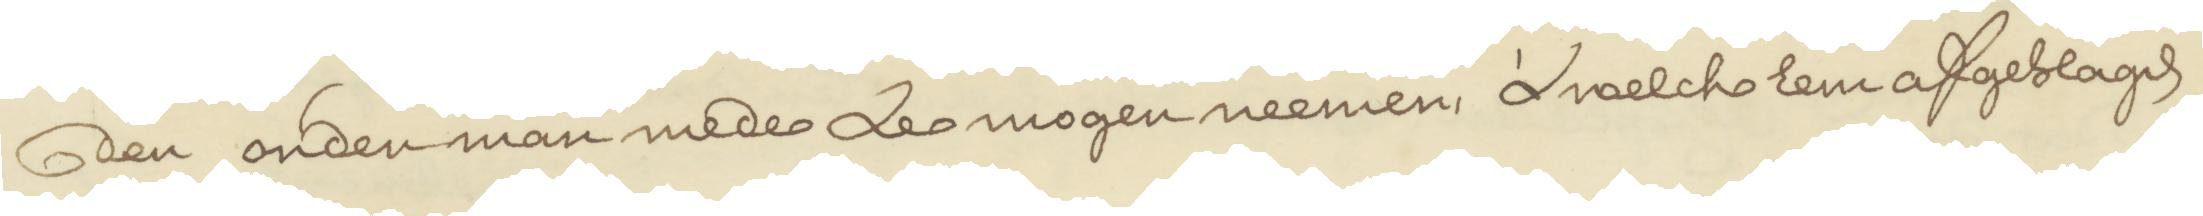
den ouder man mede te mogen neemen, 'twelck hem afgeslagen
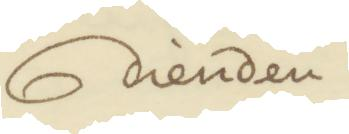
dienden
